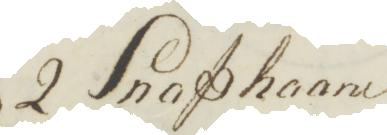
2 Snaphaane
